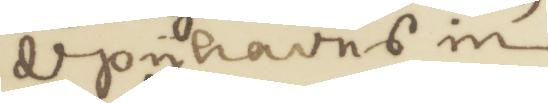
de pijkaers in
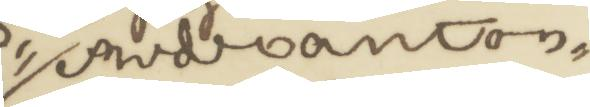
stede van con„
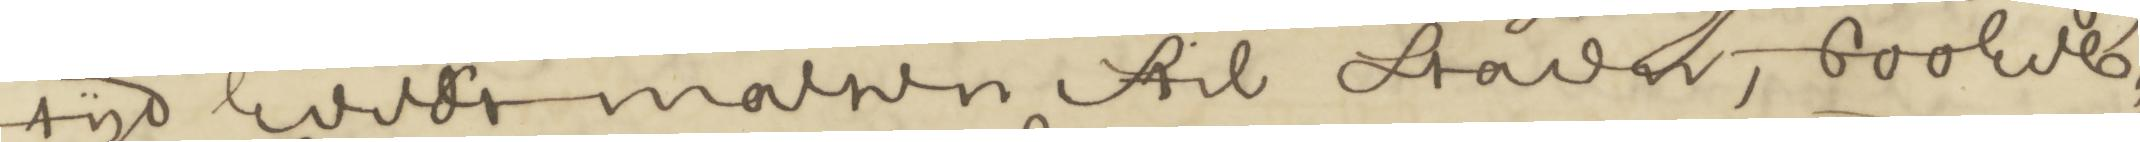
tijd heeft moeten stil staen, soo heb„
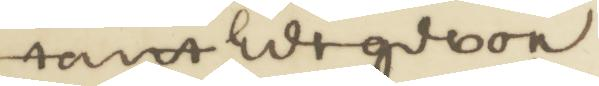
tant het gevor
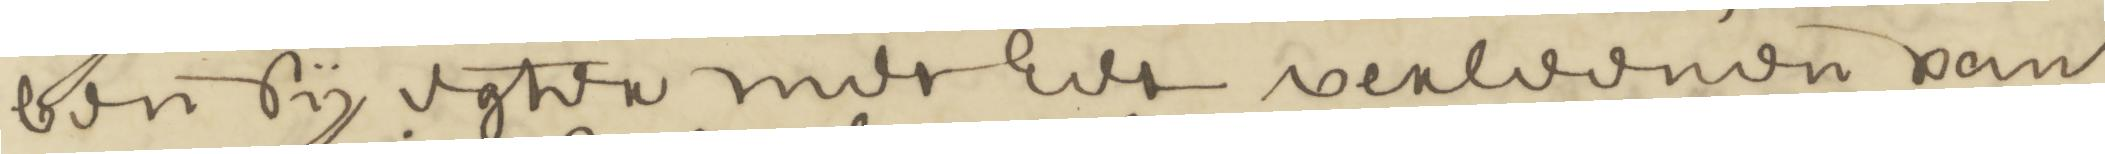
ben sij egter met het verleenen van
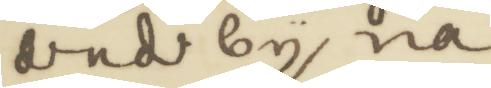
derde bij na
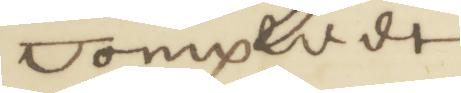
compleet
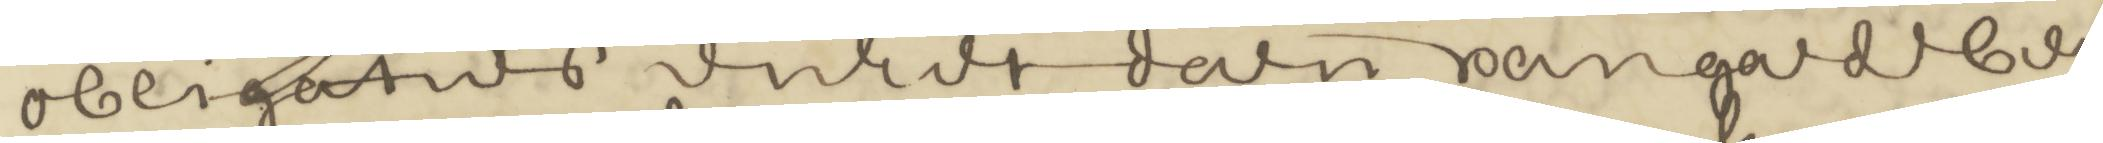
obligaties en het doen van goede be
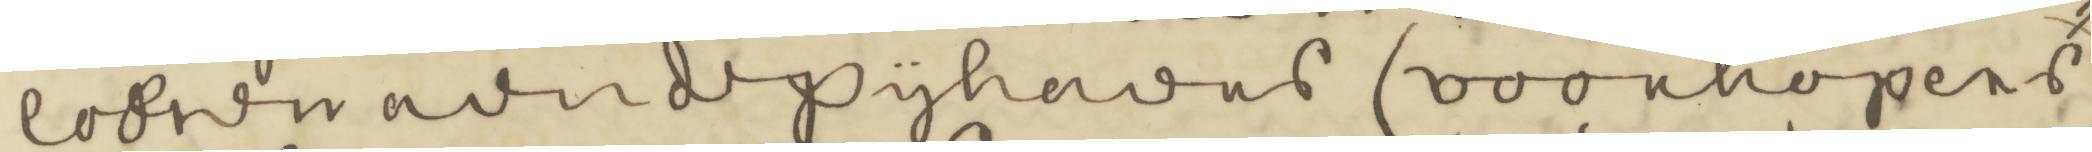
loften aen de pijkaers voorkopers
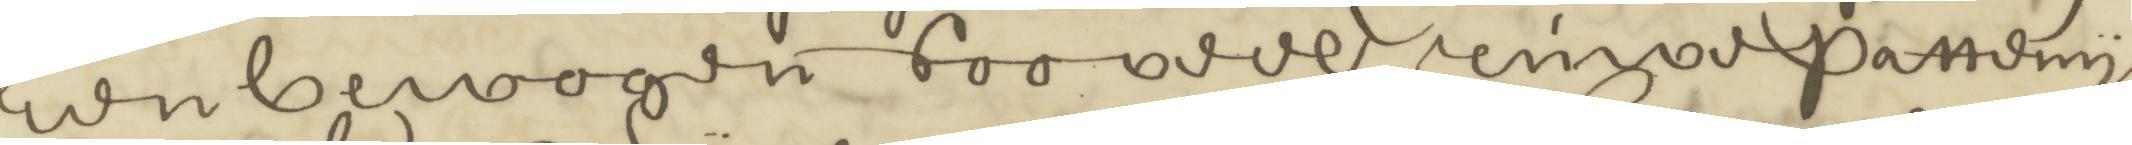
hen bewogen sooveel ruwe pattenij
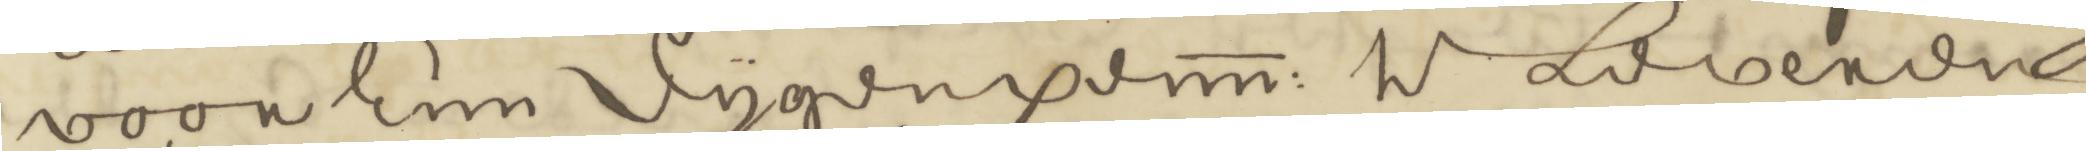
voor hun Eijgen penn: te leveren
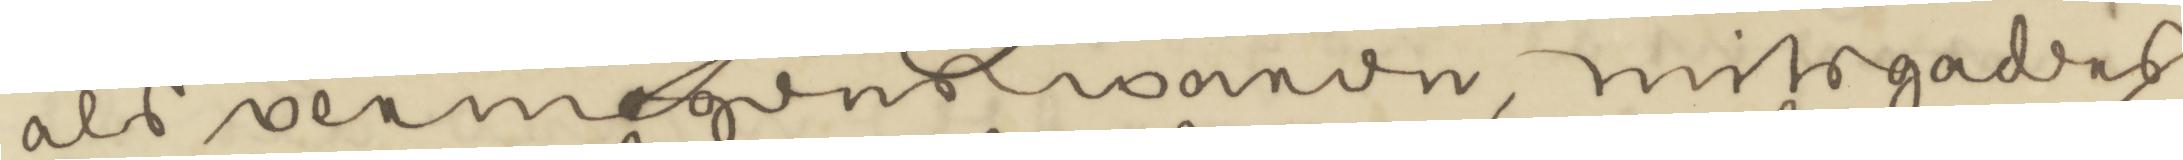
als vermogens waren mitsgaders
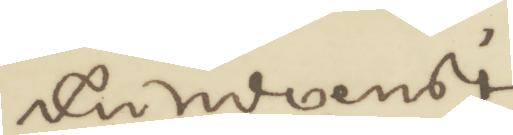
En nevens't
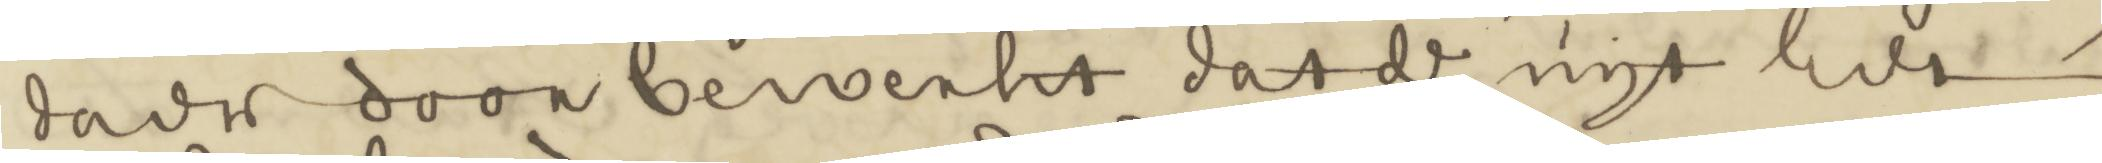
daer door bewerkt dat de uijt het
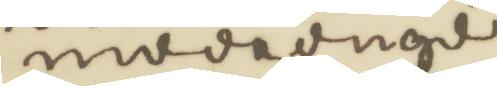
meerenge
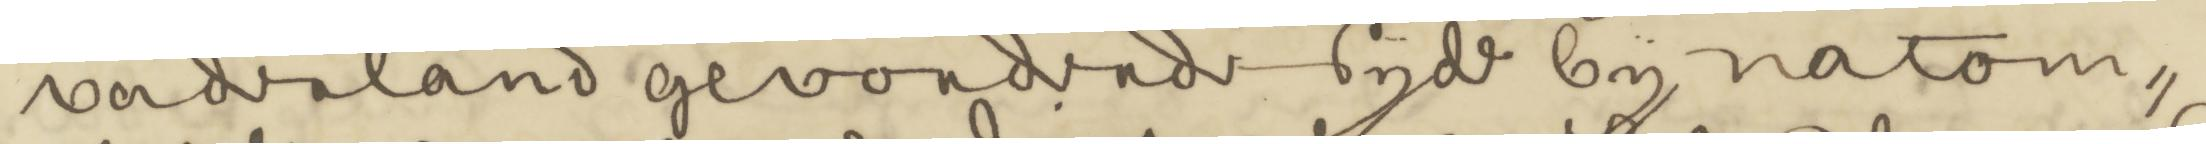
vaderland gevorderde sijde bij na com„
